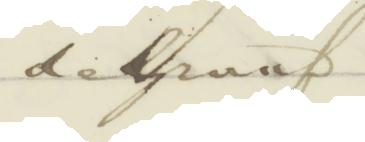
de Graaf
